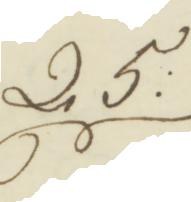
25:
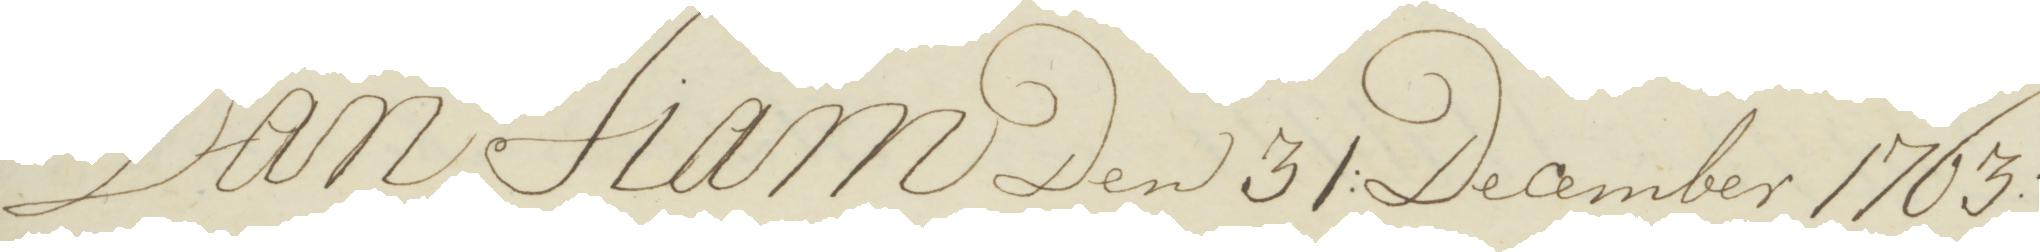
Van Siam Den 31: December 1763:
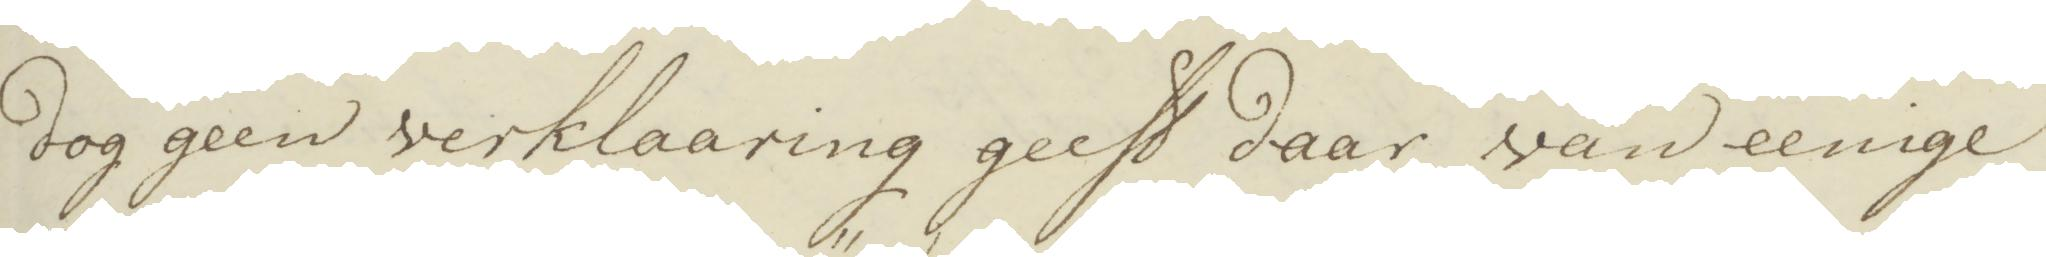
dog geen verklaaring geeft daar van eenige
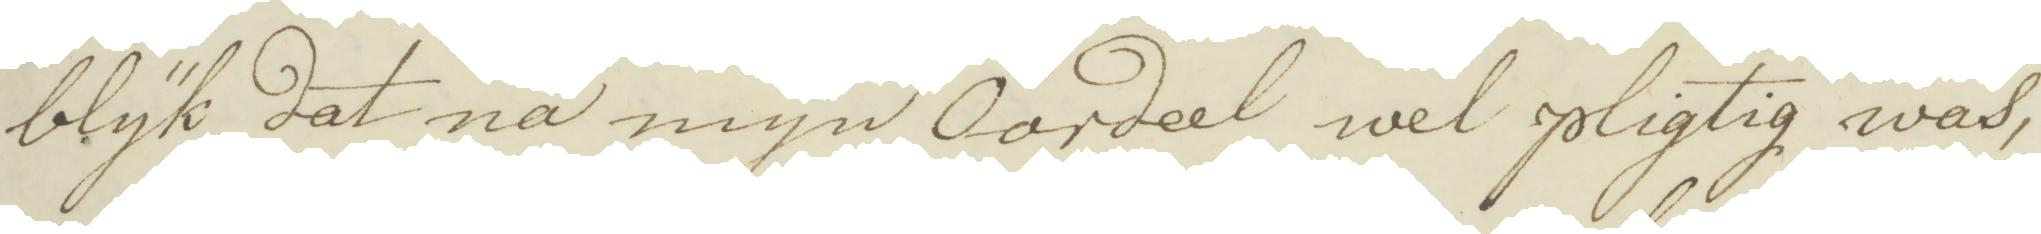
blijk dat na mijn Oordeel wel pligtig was,
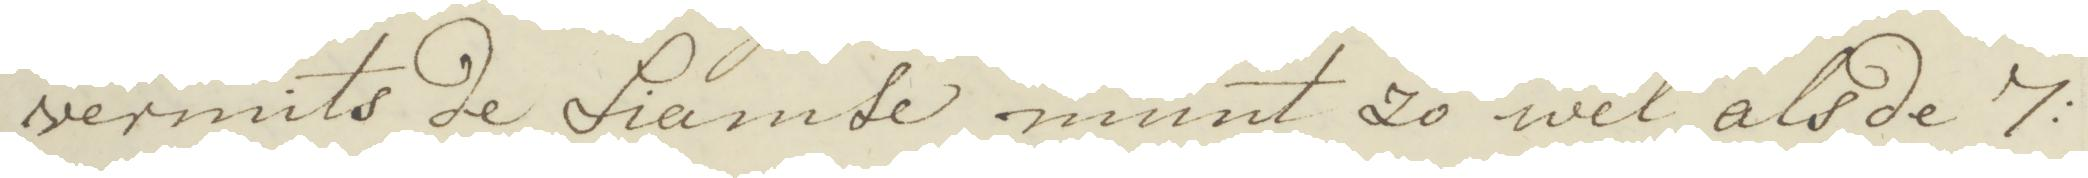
vermits de siamse munt zo wel als de 7:
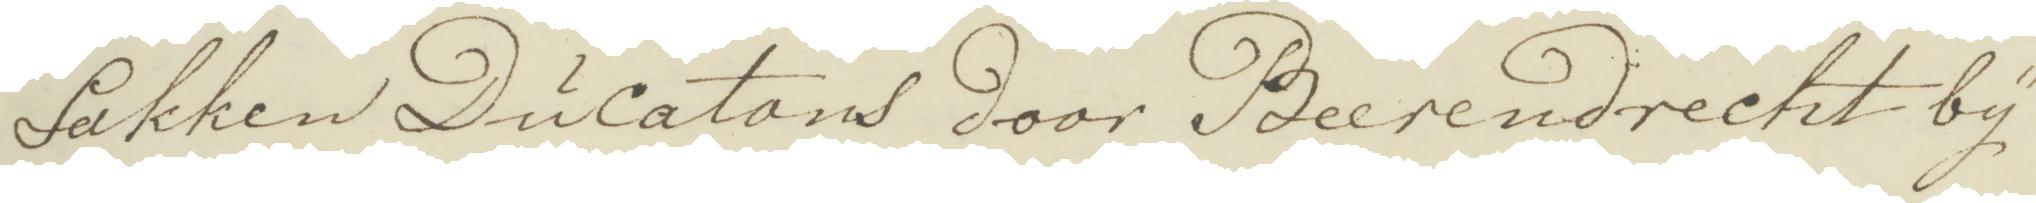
sakken Ducatons door Beerendrecht bij
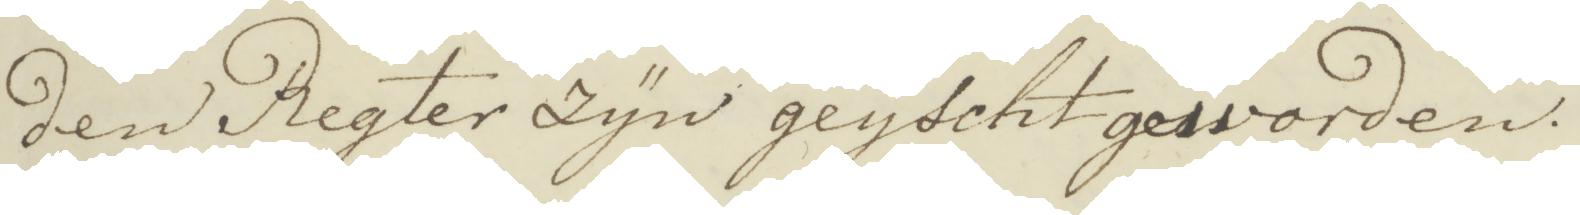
den Regter zijn geijscht geworden.
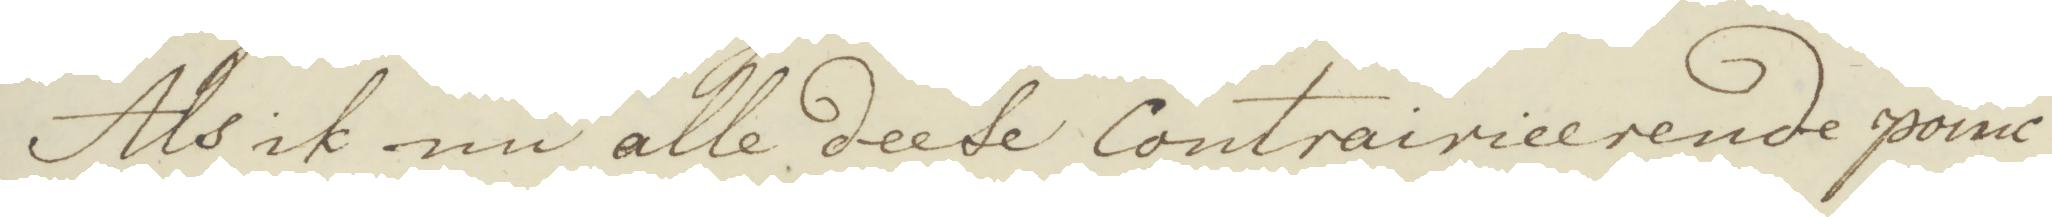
Als ik nu alle deese contrairieerende poinc
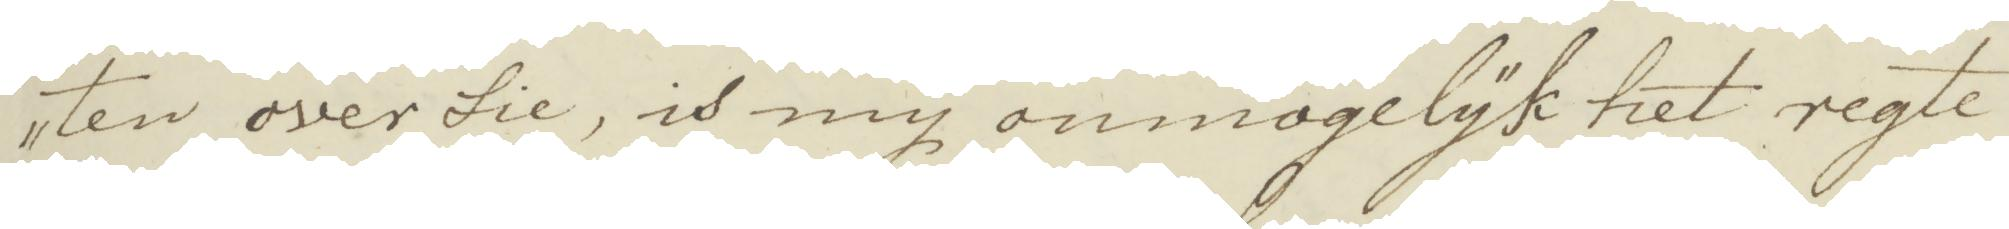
„ten over sie, is mij onmogelijk het regte
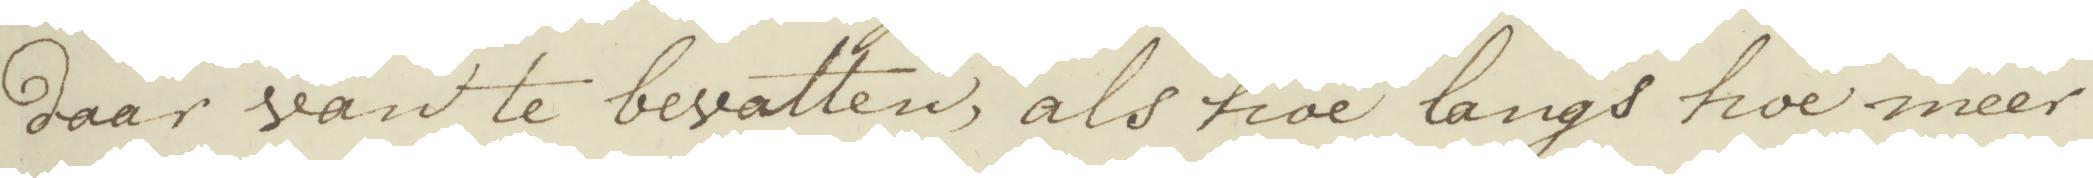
daar van te bevatten, als hoe langs hoe meer
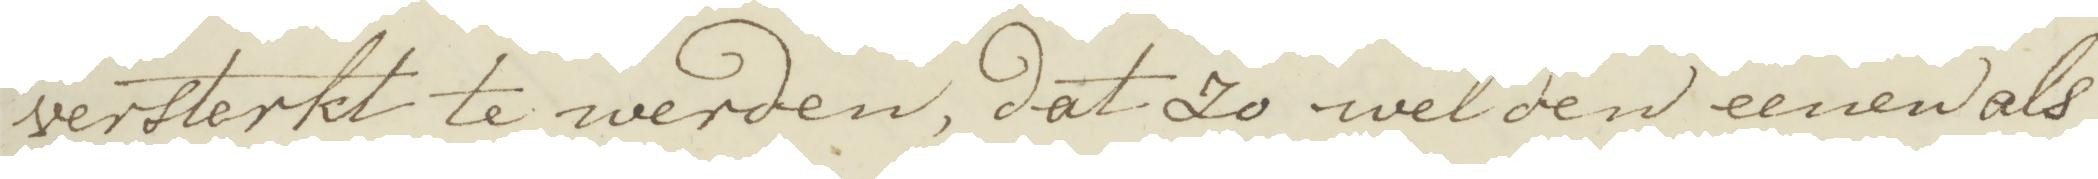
versterkt te werden, dat zo wel den eenen als
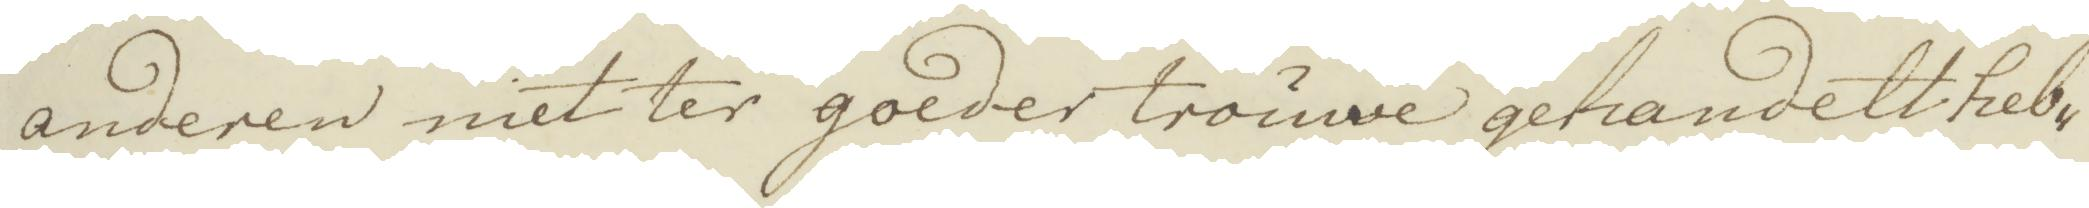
anderen niet ter goeder trouwe gehandelt heb„
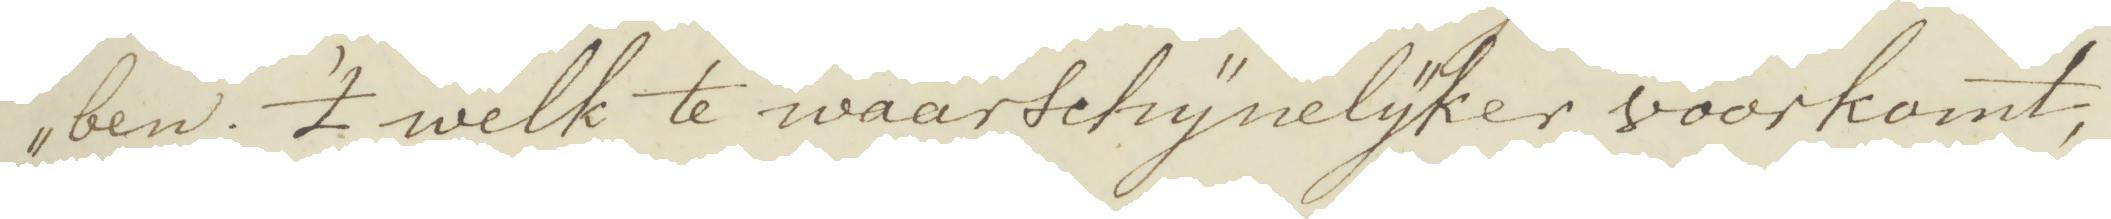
„ben. ’t welk te waarschijnelijker voorkomt,
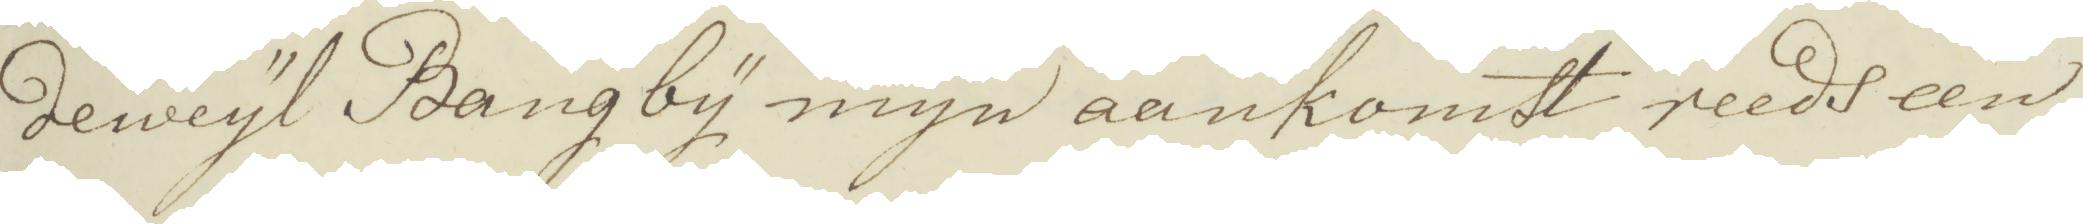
deweijl Bang bij mijn aankomst reeds een
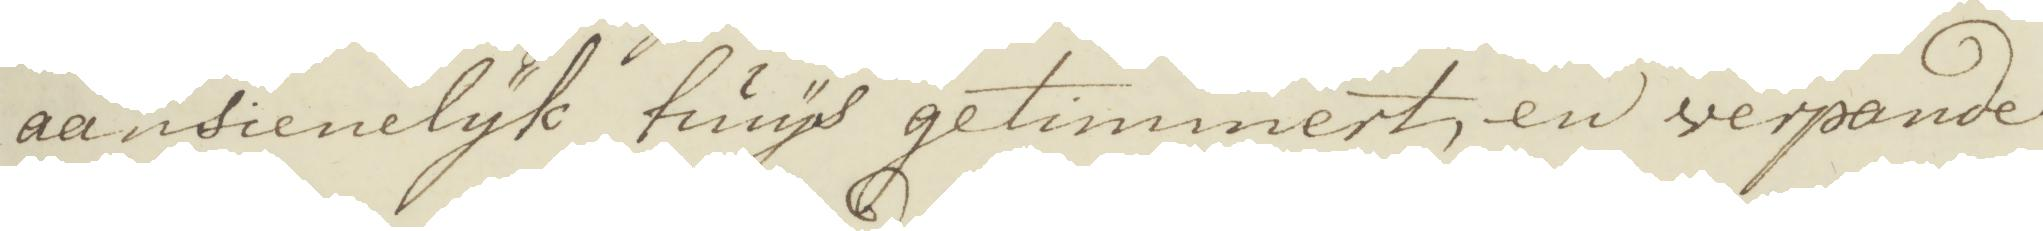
aansienelijk huijs getimmert, en verpande
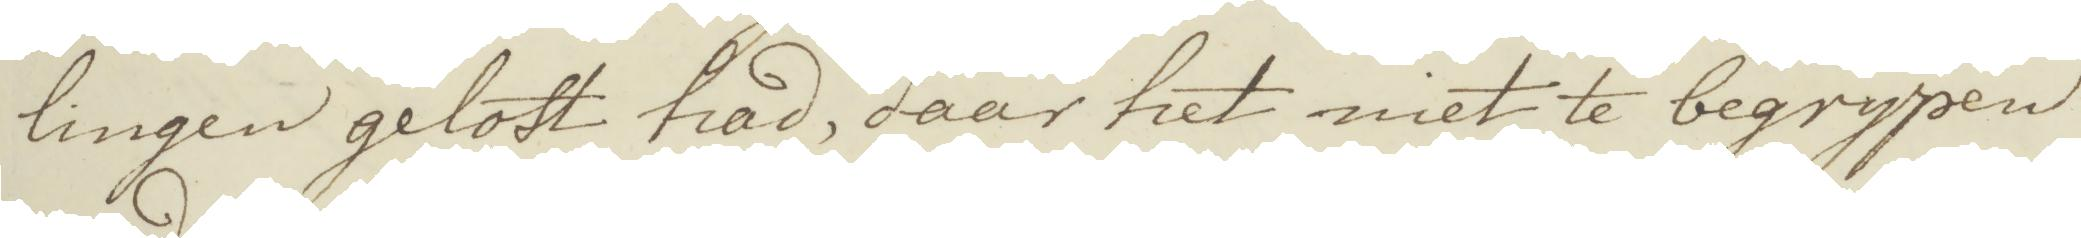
lingen gelost had, daar het niet te begrijpen
